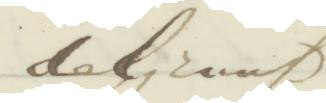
de Graaf
